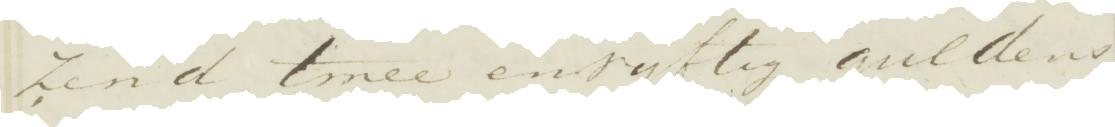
zend twee en vyftig guldens
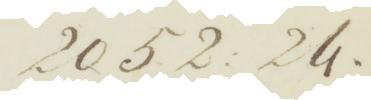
2052: 24.
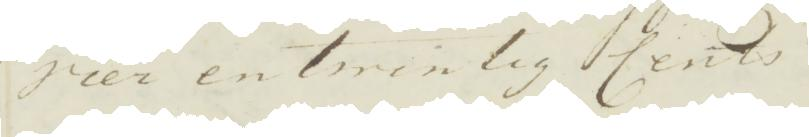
vier en twintig Cents
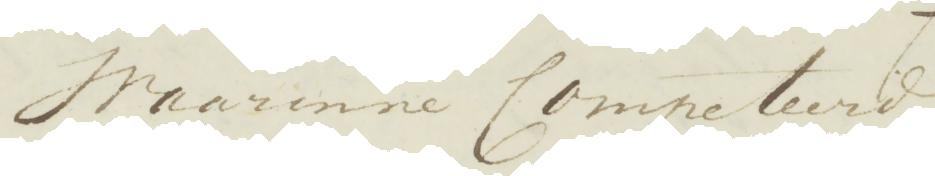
Waarinne Competeerd
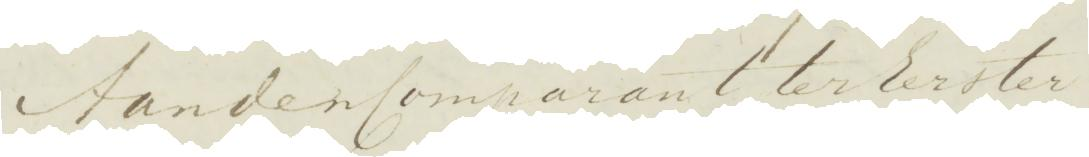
Aan den Comparant ter Eerster
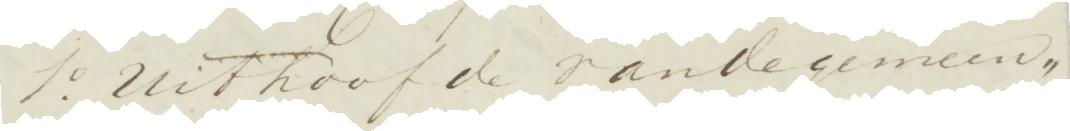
1.o Uit hoofde van de gemeen„
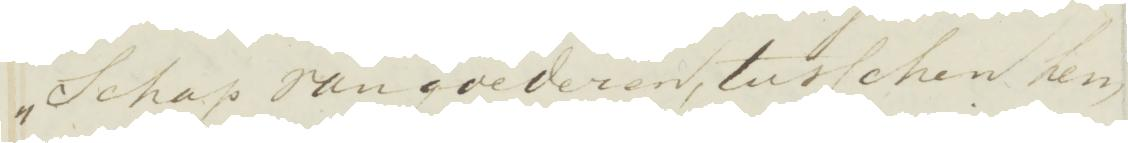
„schap van goederen, tusschen hem
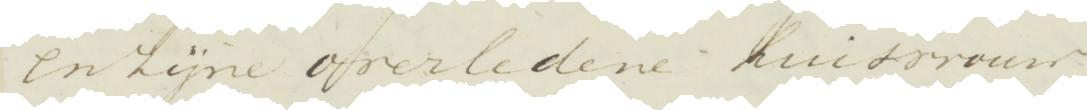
En zijne overledene huisvrouw
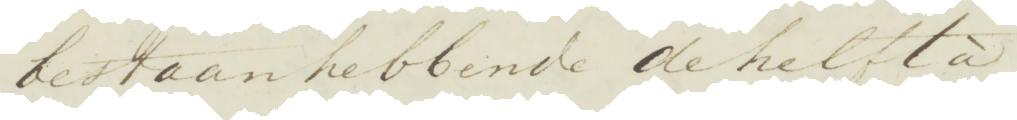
bestaan hebbende de helft à
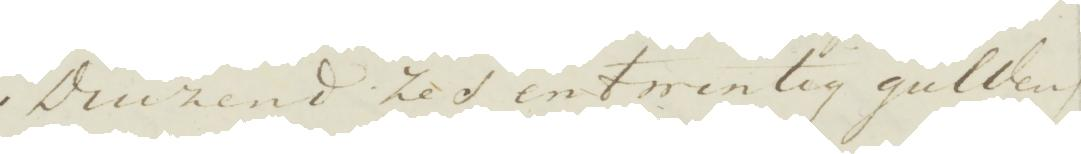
Duizend zes en twintig gulden
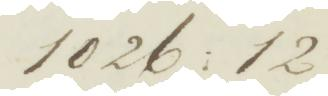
1026: 12
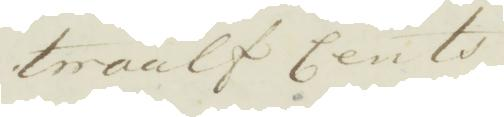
twaalf Cents
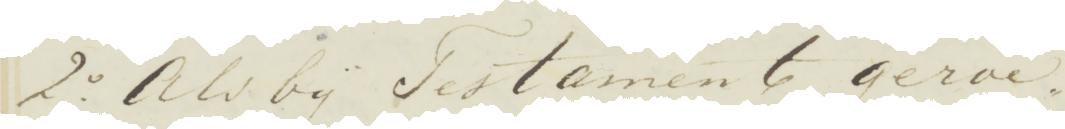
2.o Als bij Testament geroe„
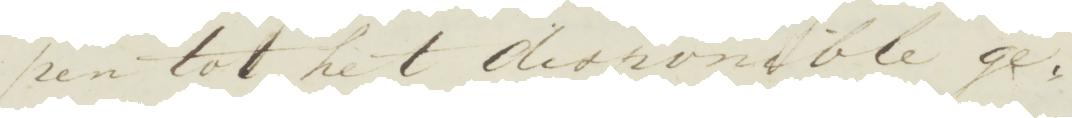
pen tot het disponible ge„
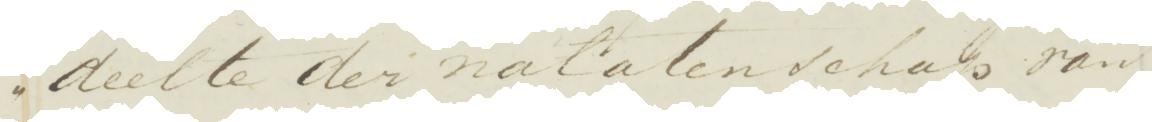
„deelte der nalatenschap van
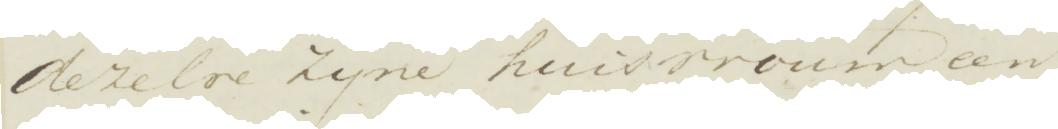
dezelve zijne huisvrouw een
